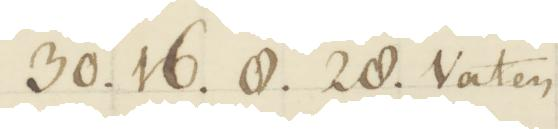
30.16.8.28. Vaten
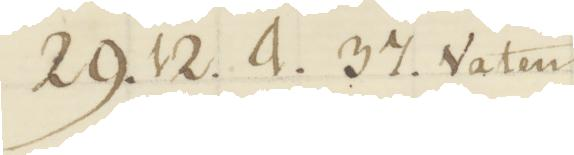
29.12.4.37. Vaten
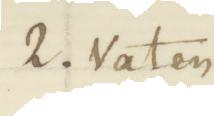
2. Vaten
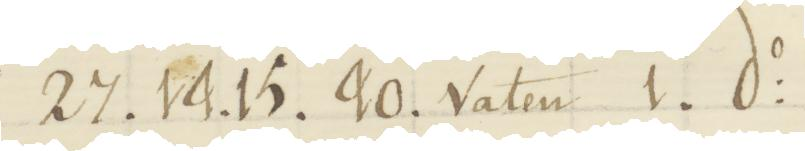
27. 14.15. 40 Vaten 1. d:o
